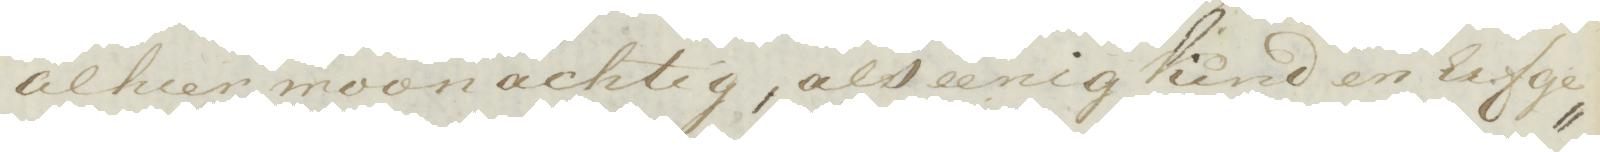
alhier woonachtig , als eenig kind en Erfge„
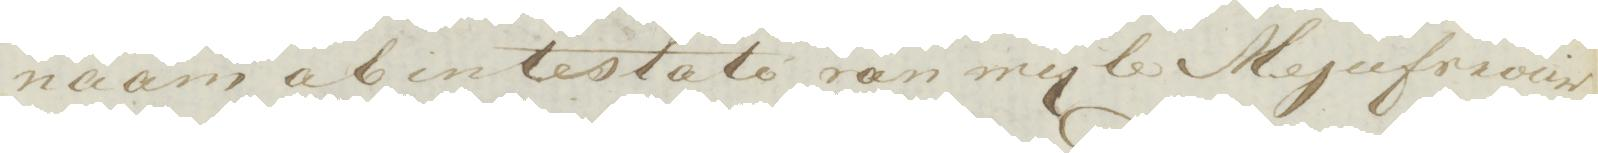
naam ab intestato van wyle Mejufvrouw
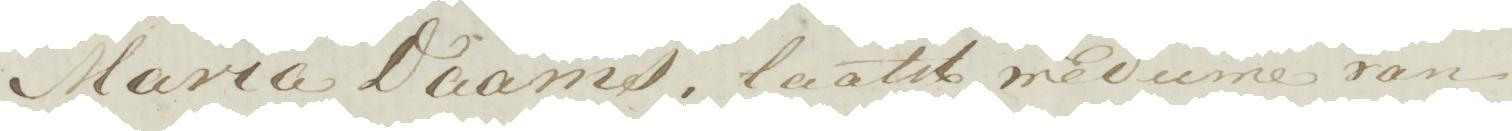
Maria Daams, laatst weduwe van
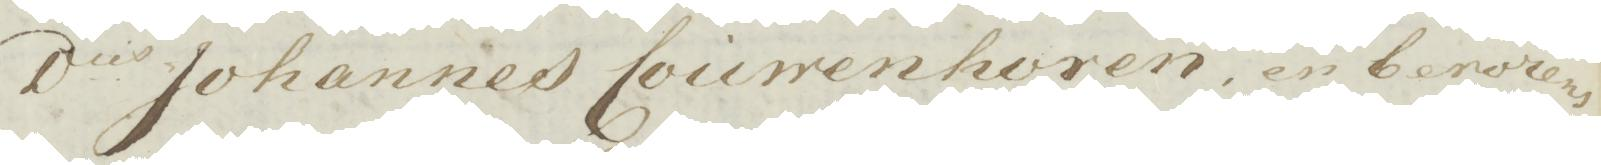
D:us Johannes Couwenhoven, en bevorens
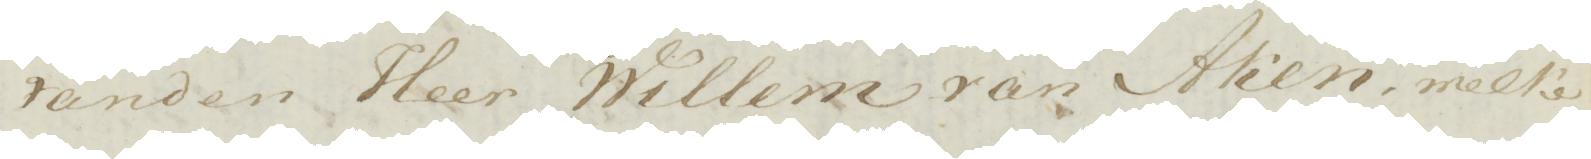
van den Heer Willem van Aken, welke
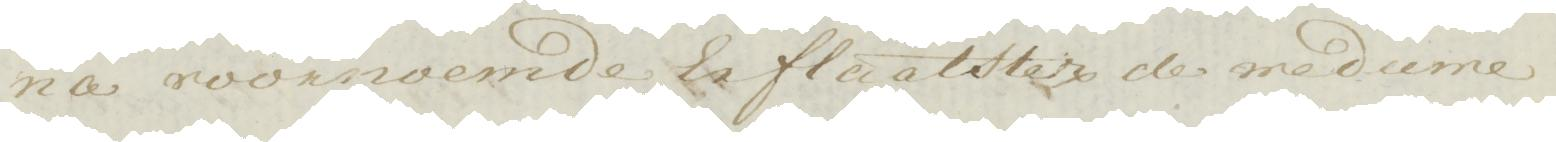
na voornoemde Erflaatster de weduwe
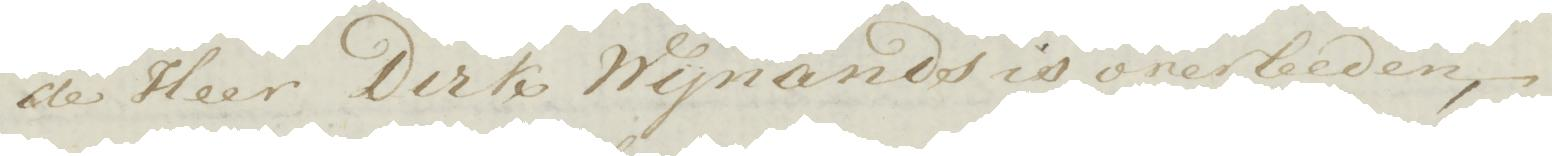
de Heer Dirk Wijnands is overleeden,
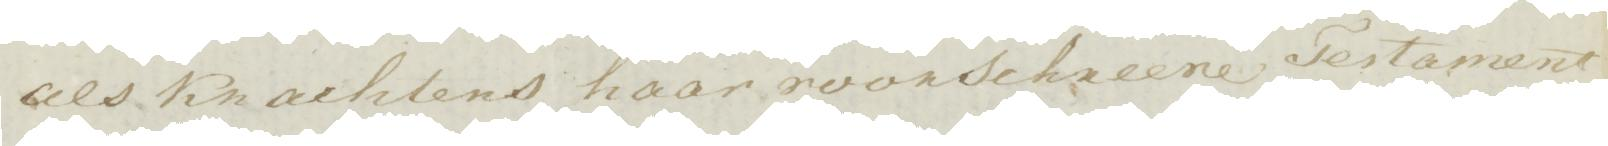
als krachtens haar voorschreeve Testament
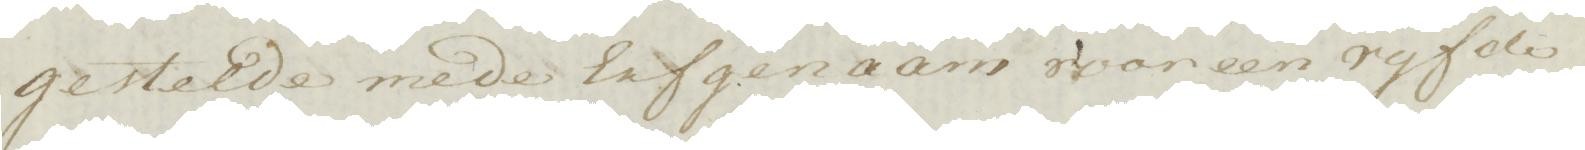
gestelde mede Erfgenaam voor een vijfde
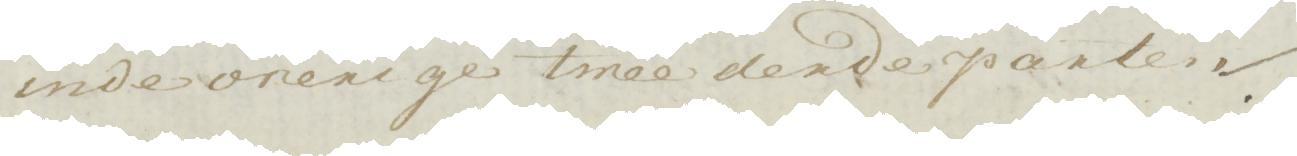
in de overige twee derde parten
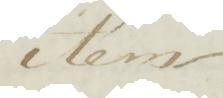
item
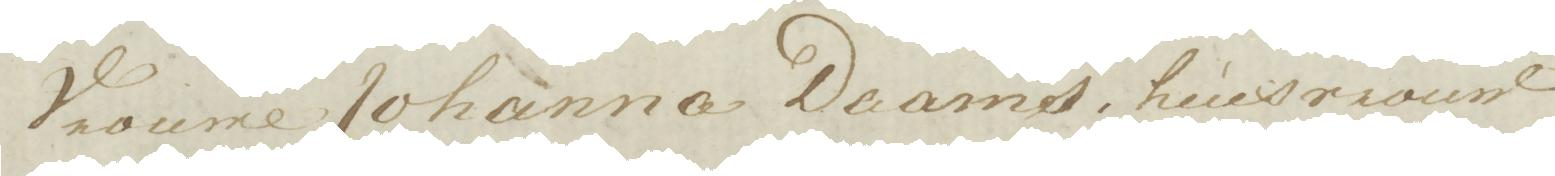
Vrouwe Johanna Daams, huisvrouw
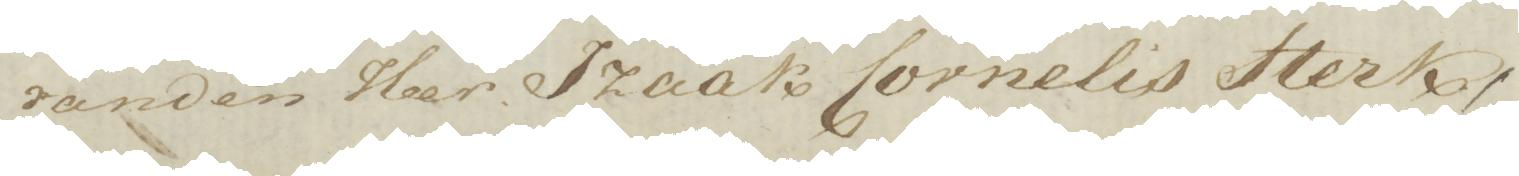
van den Heer Izaak Cornelis Sterk/
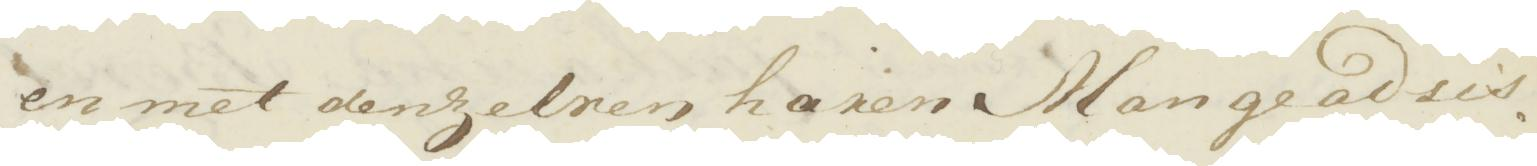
en met denzelven haren Man geadsis„
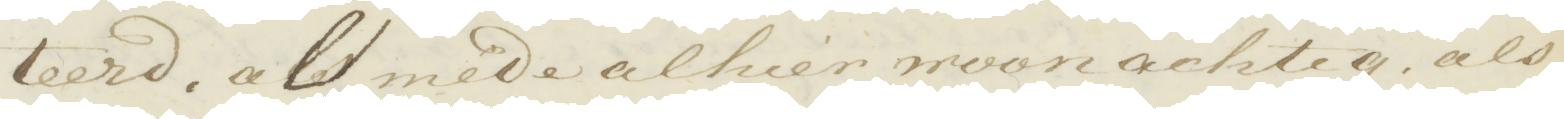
teerd, als mede alhier woonachtig, als
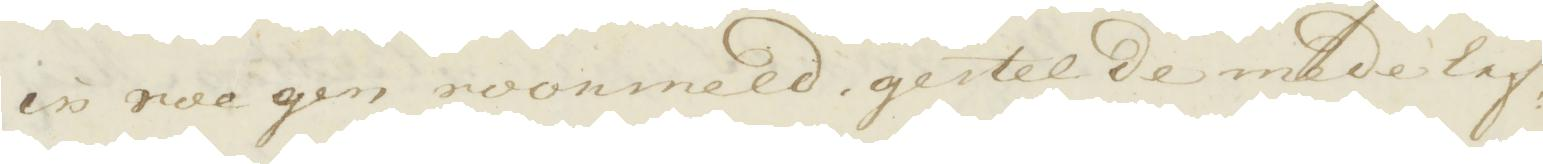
in voegen voormeld, gestelde mede Erf
